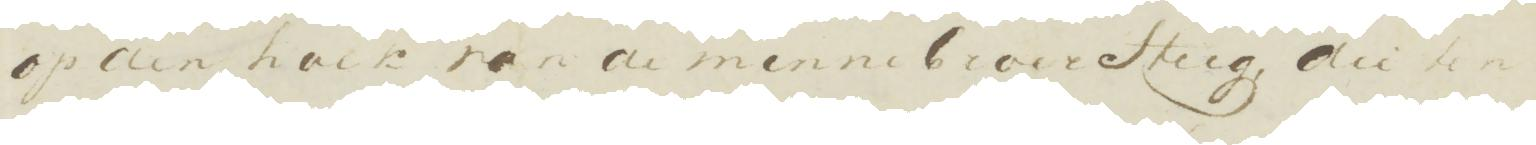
op den hoek van de minnebroersteeg, die ten
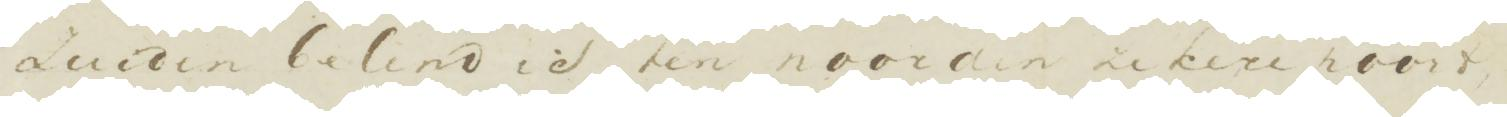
zuiden belend is, ten noorden zekere poort,
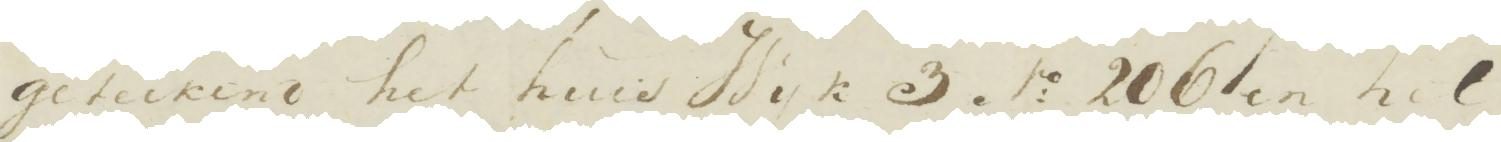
geteekend het huis Wyk 3. N:o 206 en het
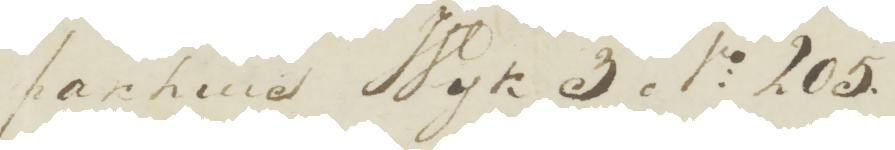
pakhuis Wyk 3 N:o 205.
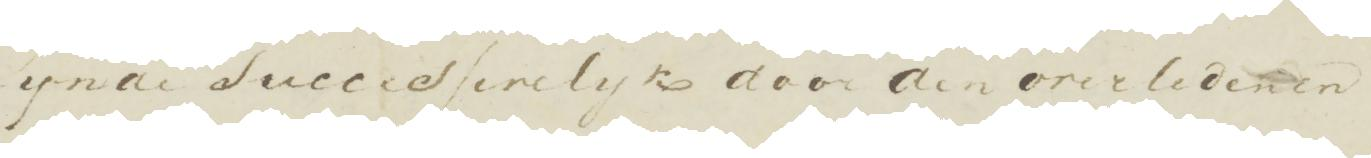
Zynde successivelyk door den overledenen
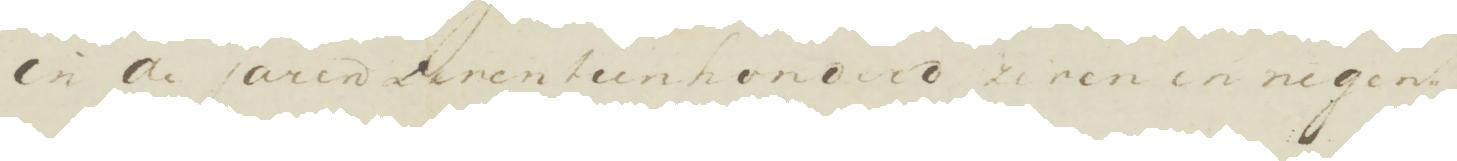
in de jaren zeventienhonderd zeven en negen„
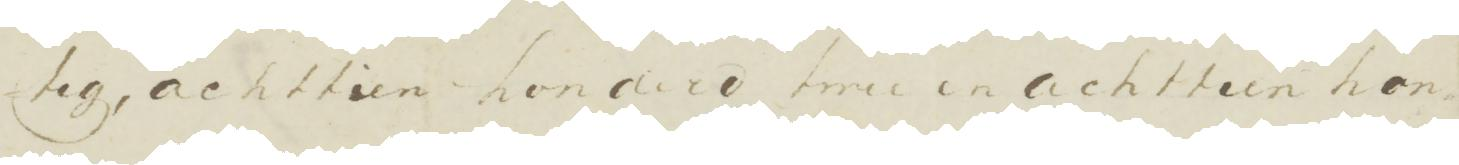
=tig, achttien honderd twee en achttien hon
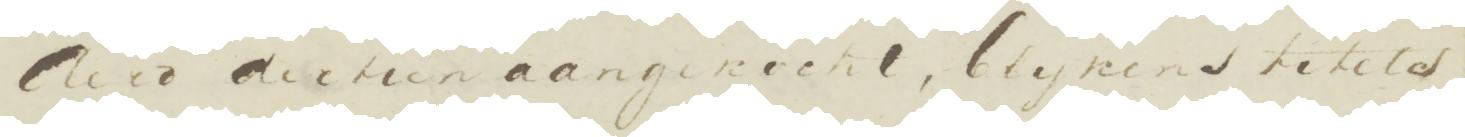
derd dertien aangekocht, blykens titels
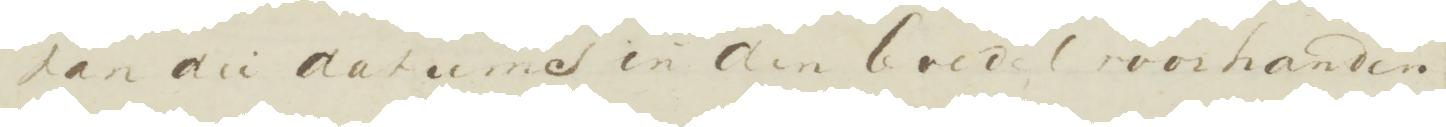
van die datums in den boedel voorhanden
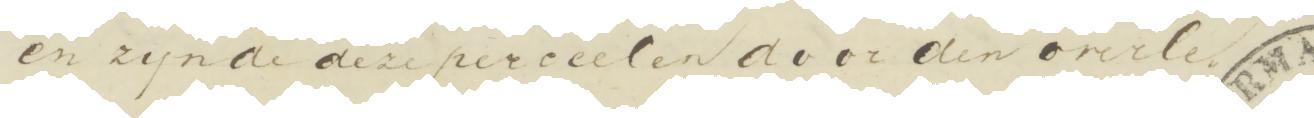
en zynde deze perceelen door den overle„
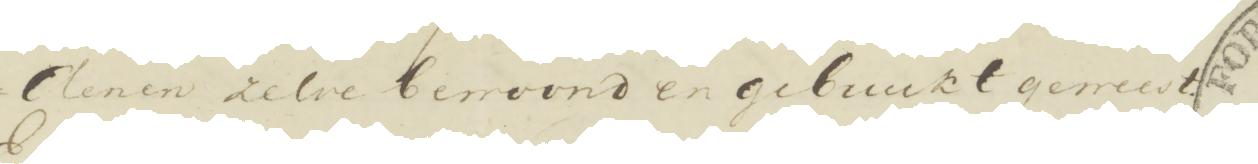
=denen zelve bewoond en gebruikt geweest.
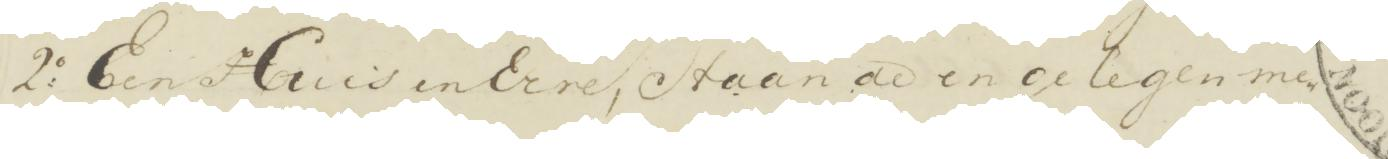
2:o Een Huis en Erve, staan de en gelegen me„
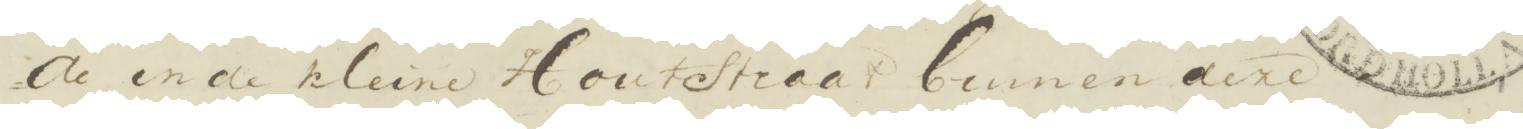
=de in de kleine Houtstraat binnen deze
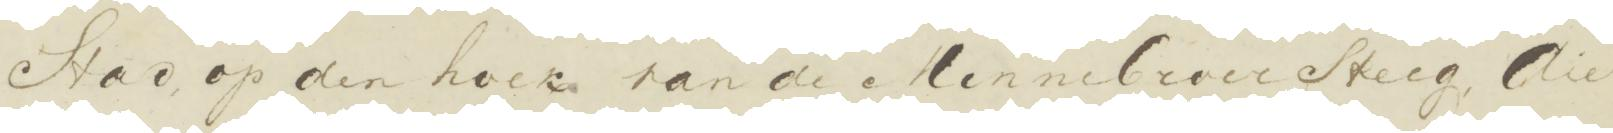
Stad, op den hoek van de Minnebroersteeg, die
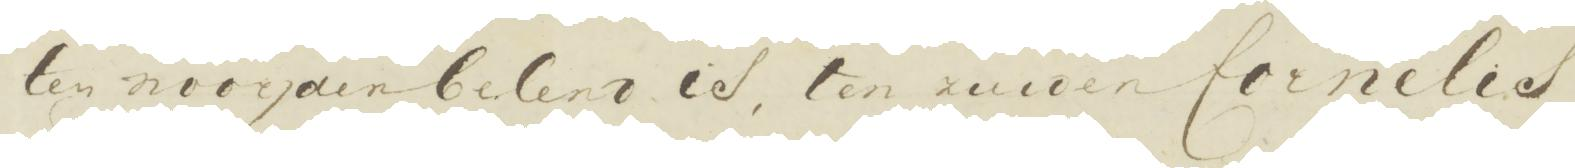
ten noorden belend is, ten zuiden Cornelis
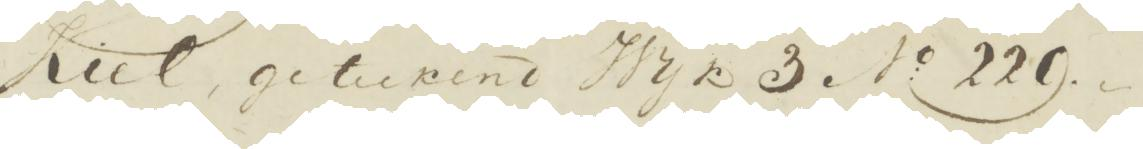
Kiel, geteekend Wyk 3 N:o 229.
